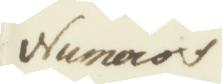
Numero's
